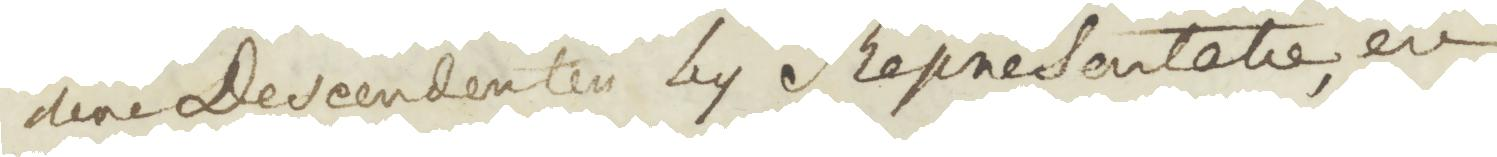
dere Descendenten by Representatie, en
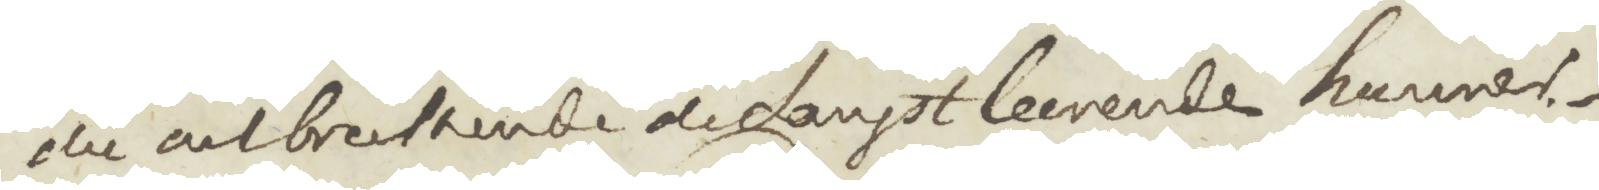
die ontbreekende de langst leevende hunner.
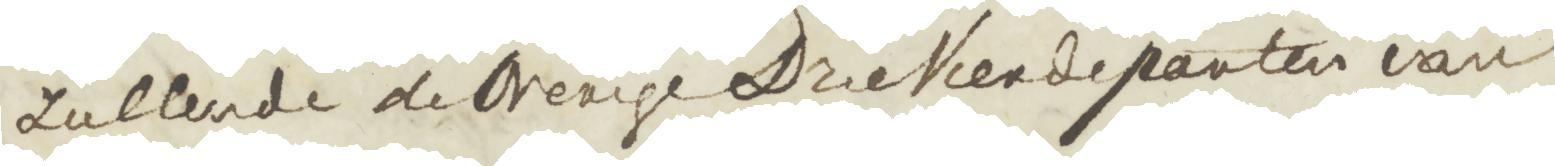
zullende de Overige Drie Vierde parten van
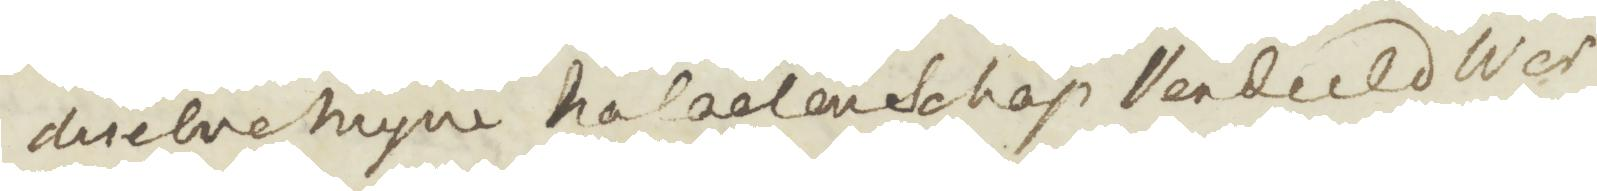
deselve myne nalaatenschap verdeeld wer
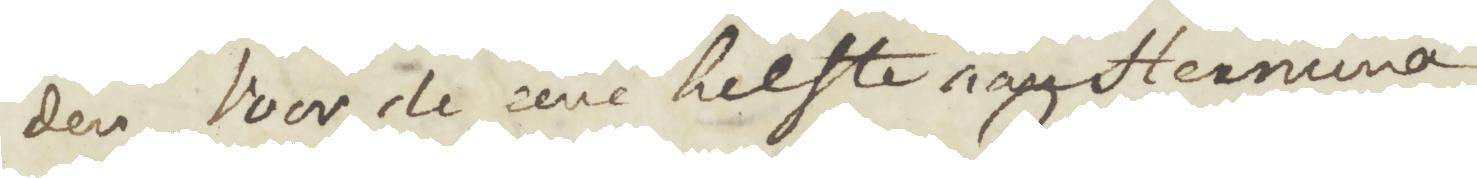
den voor de eene helfte aan Hermina
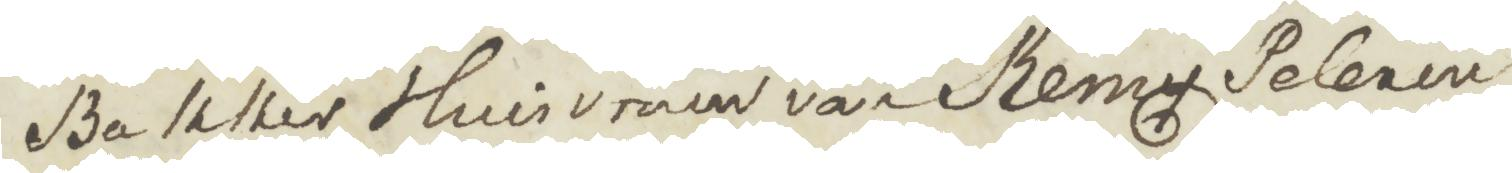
Bakker Huisvrouw van Remy Pelerin;
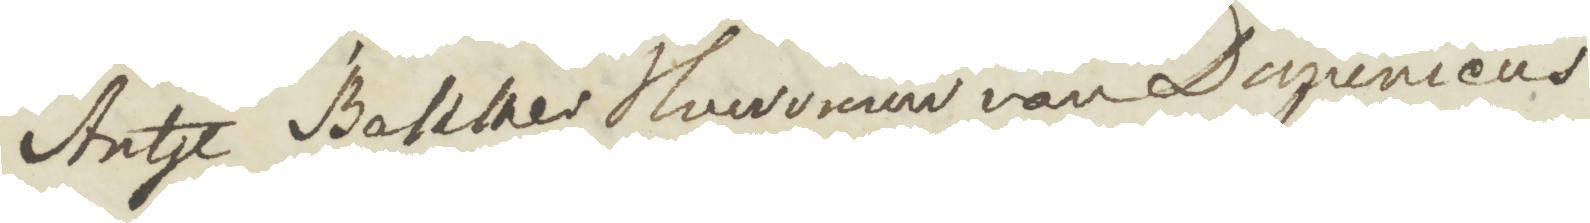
Antje Bakker, Huisvrouw van Dominicus
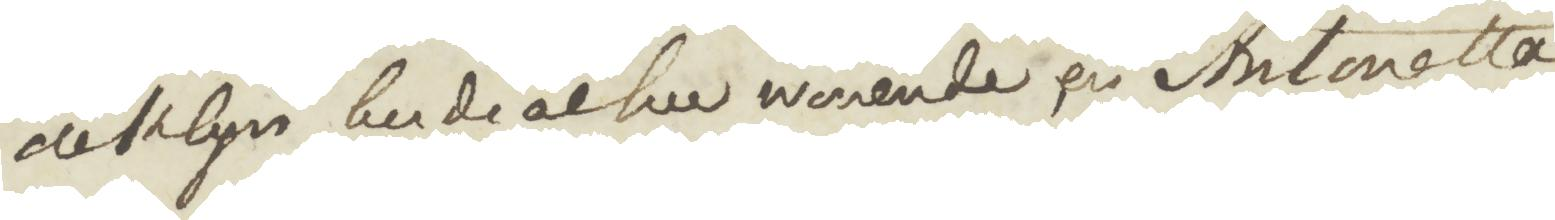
de Klyn, beide alhier wonende en Antonetta
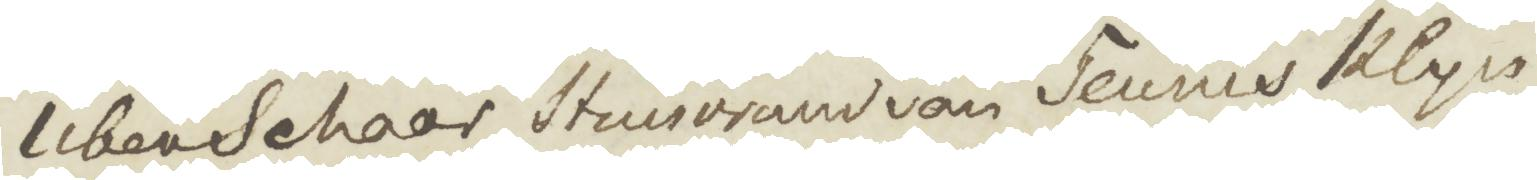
Uberschaar, Huisvrouw van Teunis Klyn
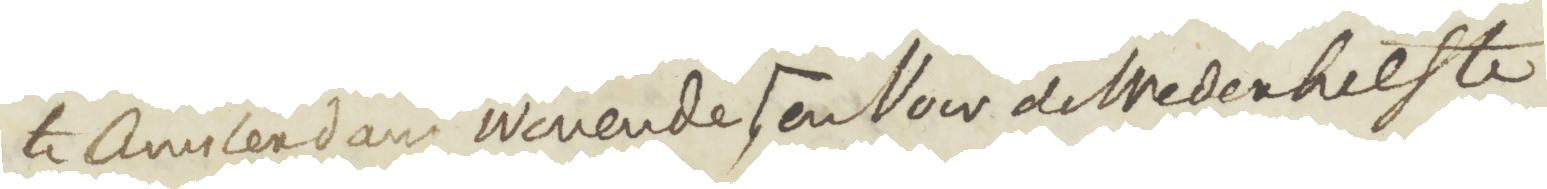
te Amsterdam wonende ^ en Voor de Wederhelfte
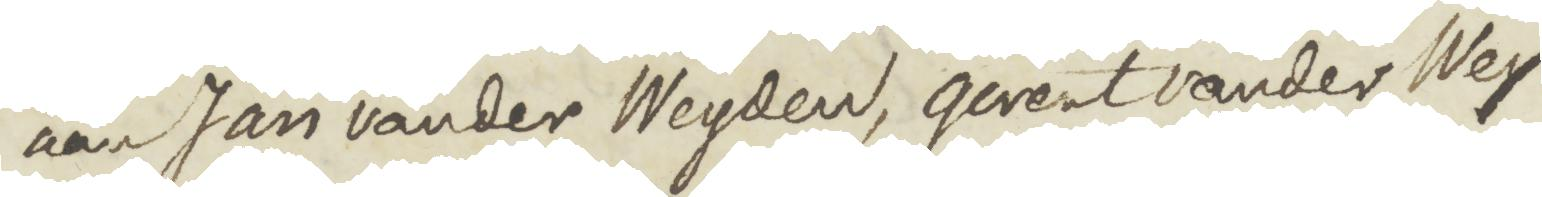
aan Jan vander Weyden, gevert vander Wey
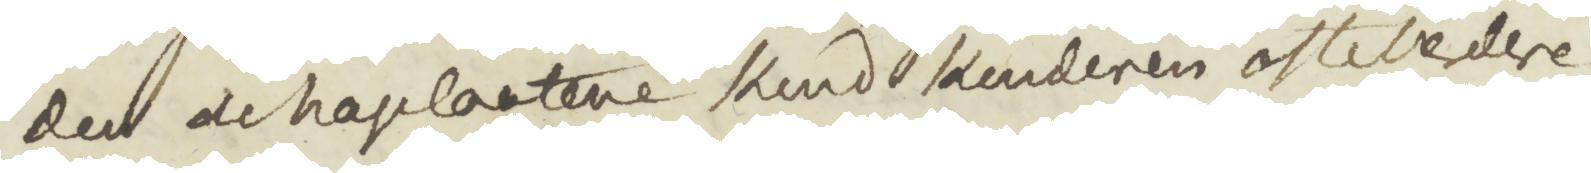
den de nagelaatene kind kinderen of te vedere
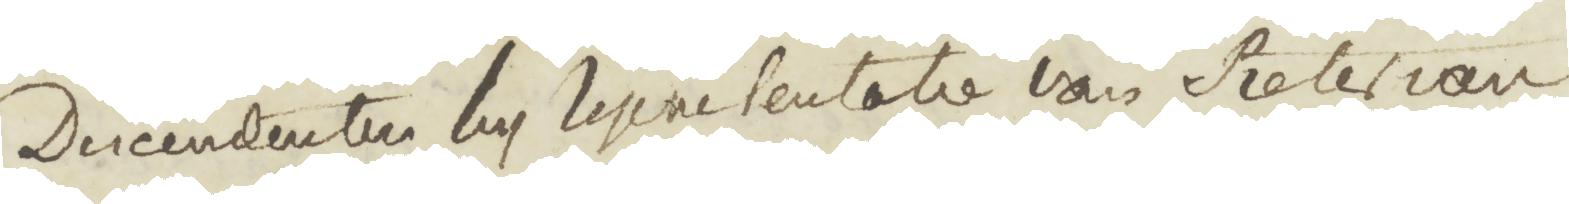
Descendenten by Representatie van Pieter van
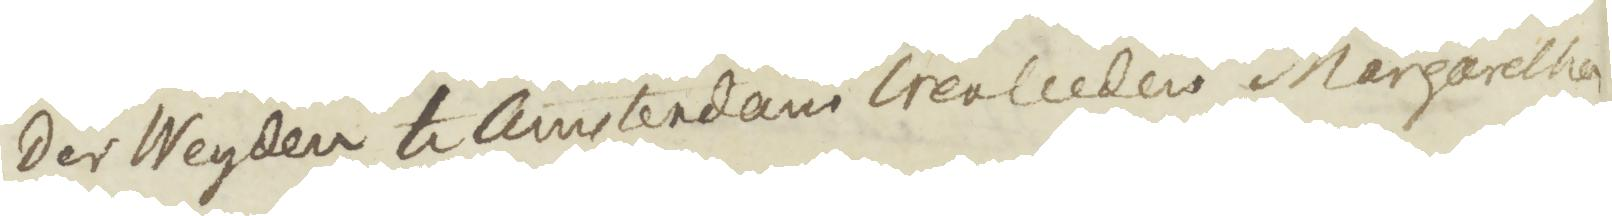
der Weyden te Amsterdam overleeden Margaretha
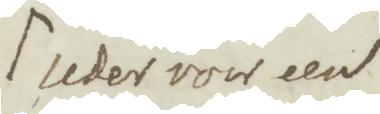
¶ ieder voor een
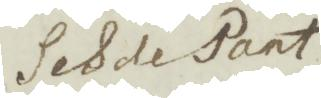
sesde Part
